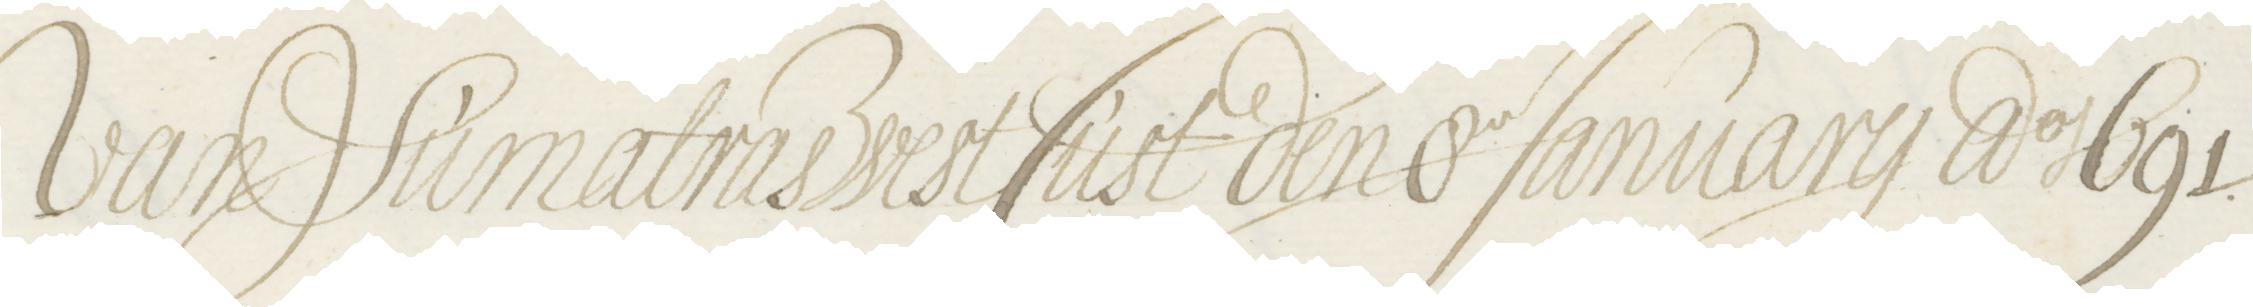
Van Sumatras west Cust den 8en Januarij Ao 1691.
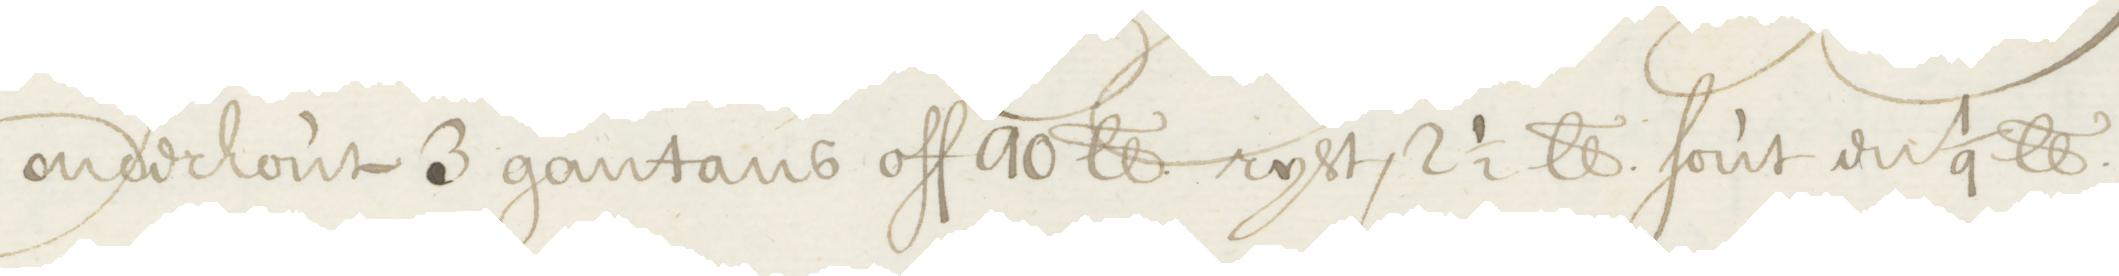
onderhout 3 gantans off 40 lb. ryst, 2½ lb. sout en ¼ lb.
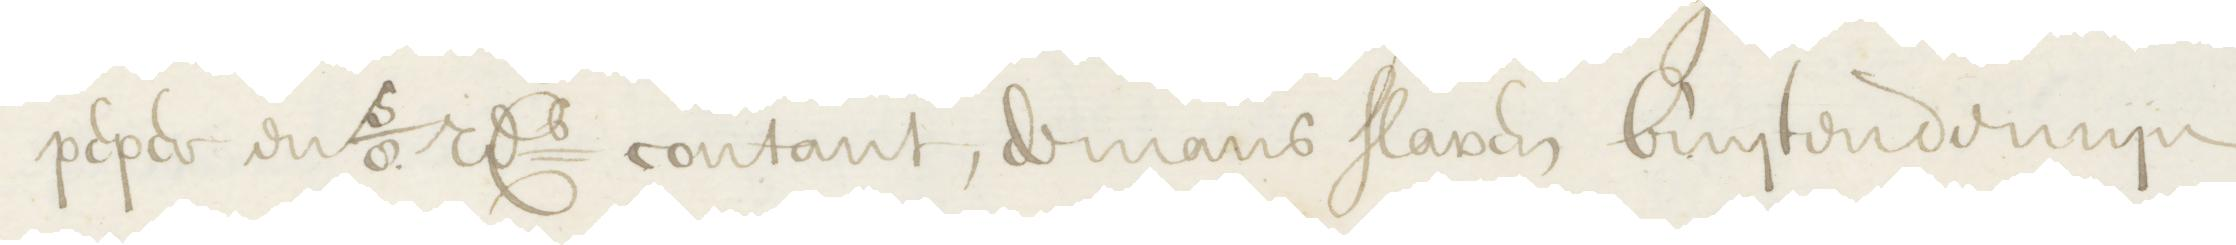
peper en 5/8 rx=s contant, de mans slaven buijten de mijn
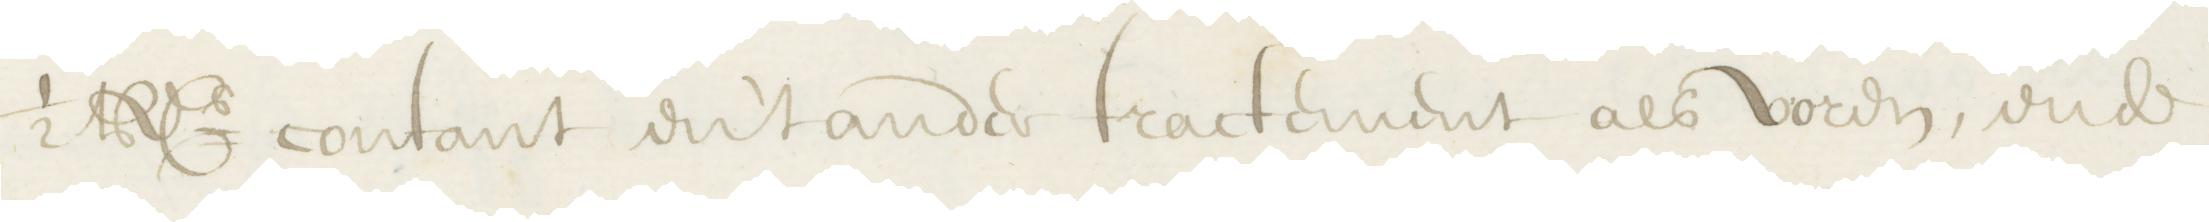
½ rx=s contant en 't ander tractement als voren, ende
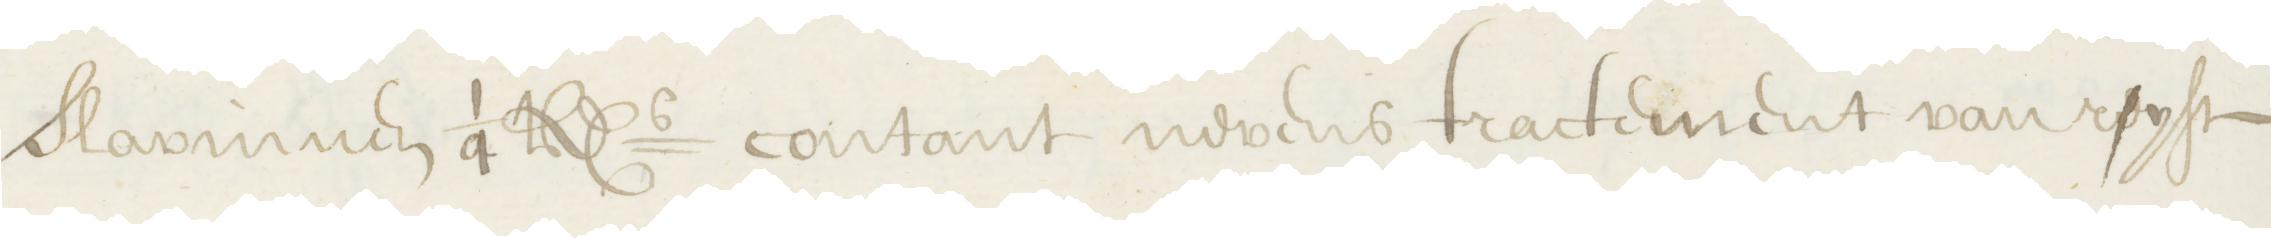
Slavinnen ¼ rx=s contant nevens tractement van ryst
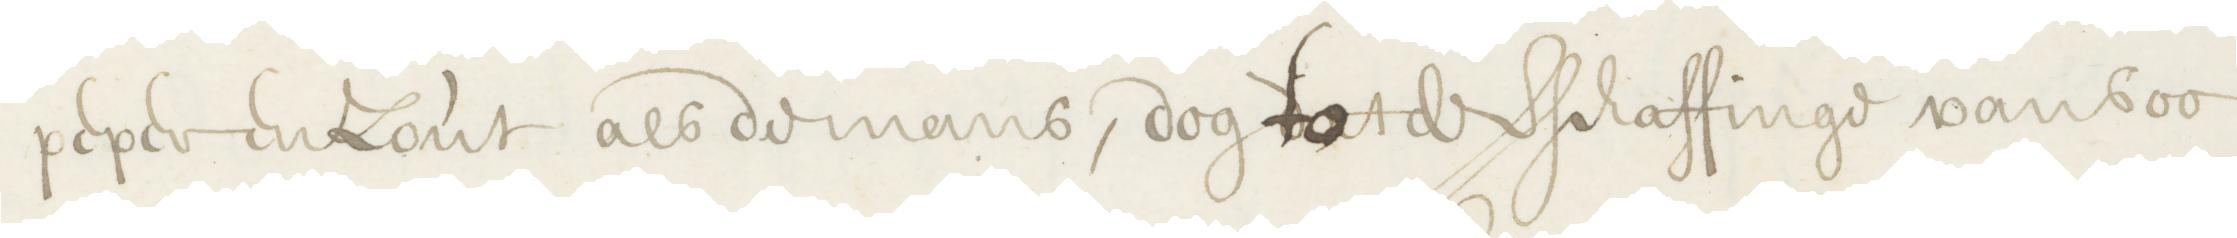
peper en zout als de mans, dog tot de verschaffinge van soo
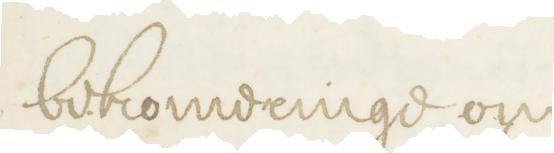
bekomeringe om
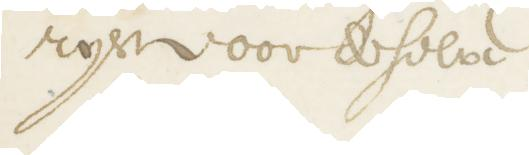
ryst voor deselve
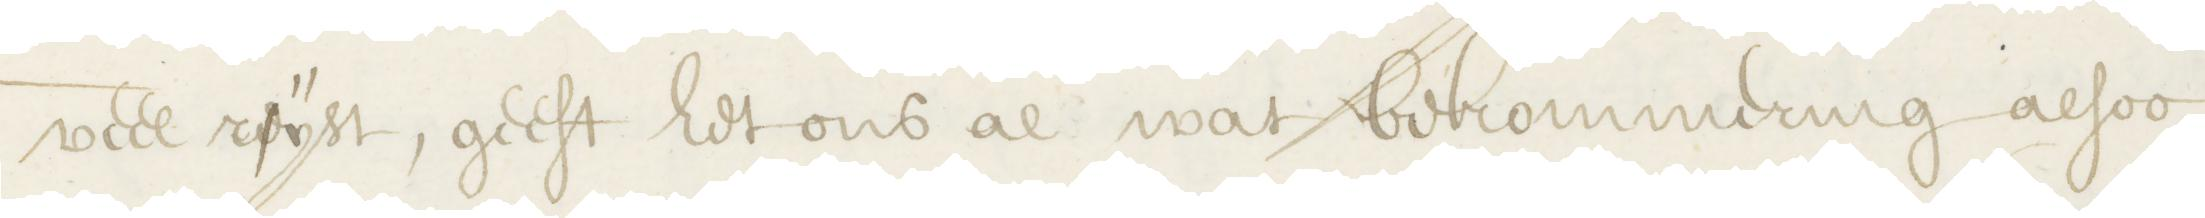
veel reyst, geeft het ons al wat bekommering alsoo
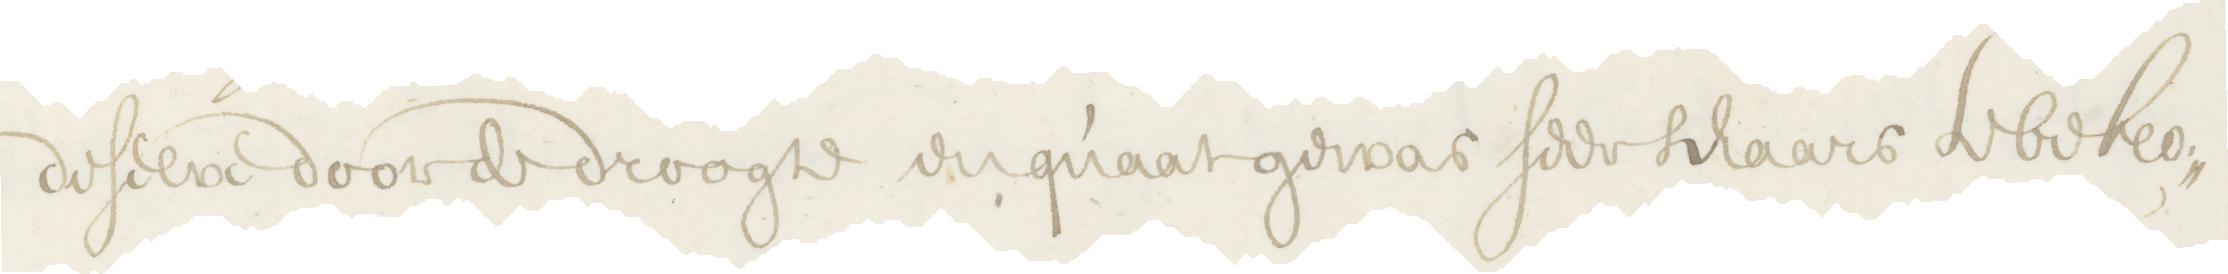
deselve door de droogte en quaat gewas seer schaars tebeko„
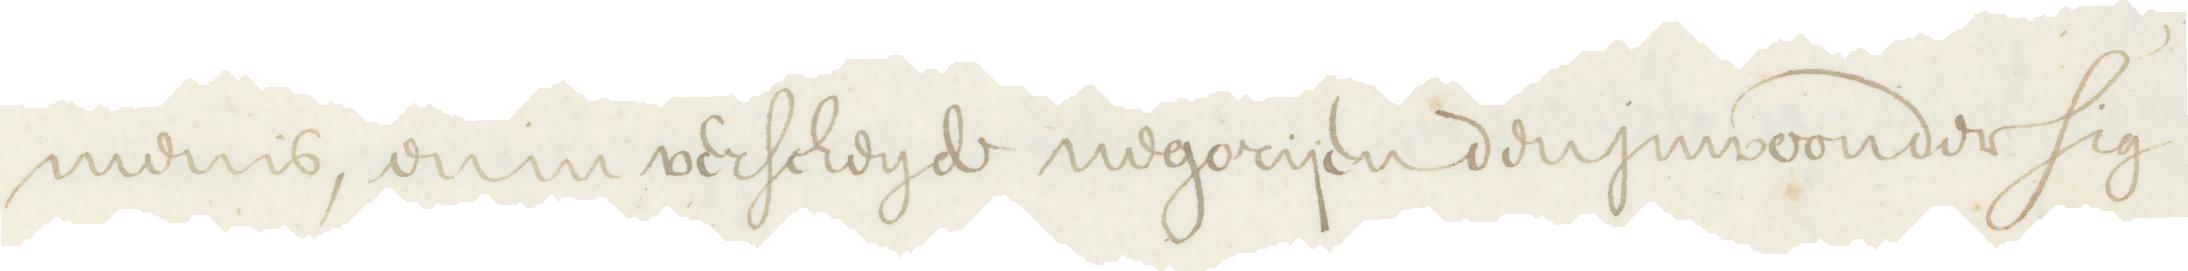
menis, en in verscheijde negorijen den jnwoonder sig
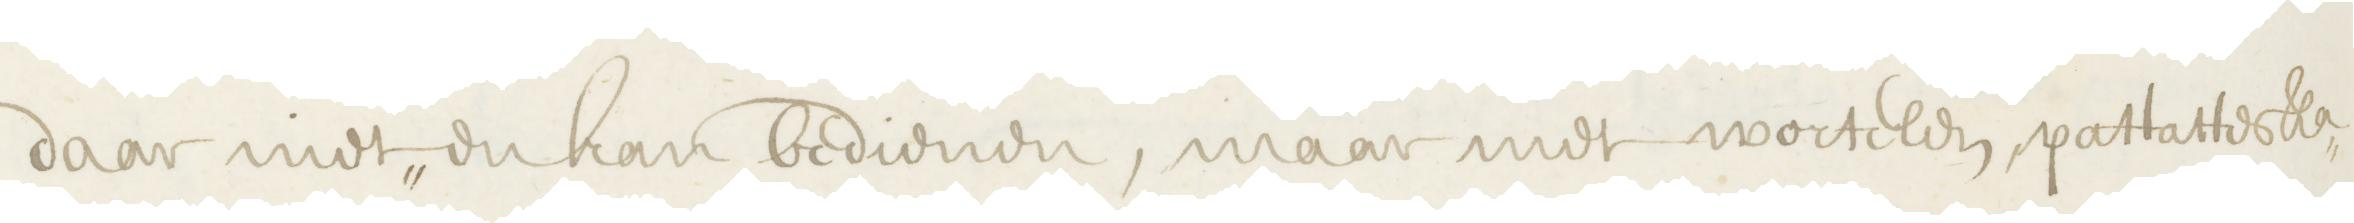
daar niet„ en kan bedienen, maar met wortelen, pattattes &„a
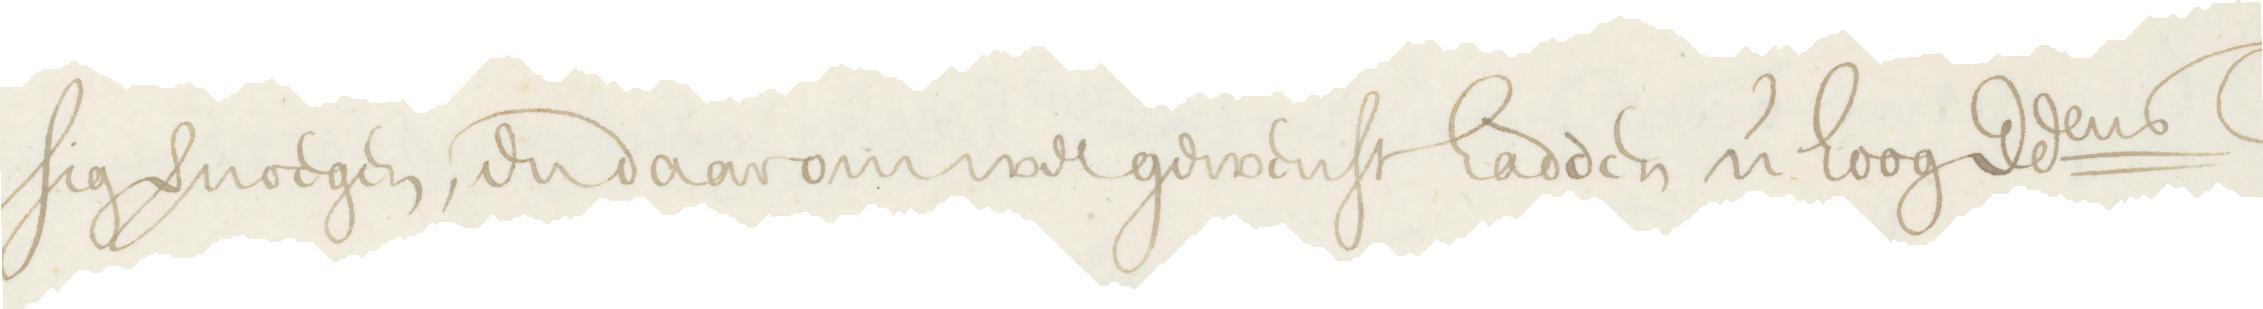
sig vernoegen, en daar om wel gewenst hadden u hoog Ed=ens
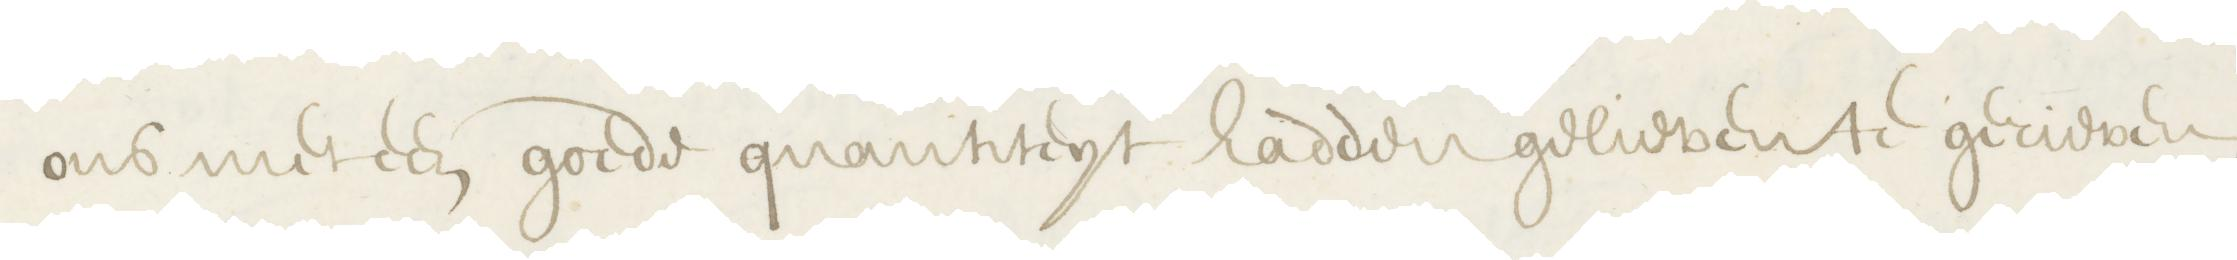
ons met een goede quantiteyt hadden gelieven te gerieven,
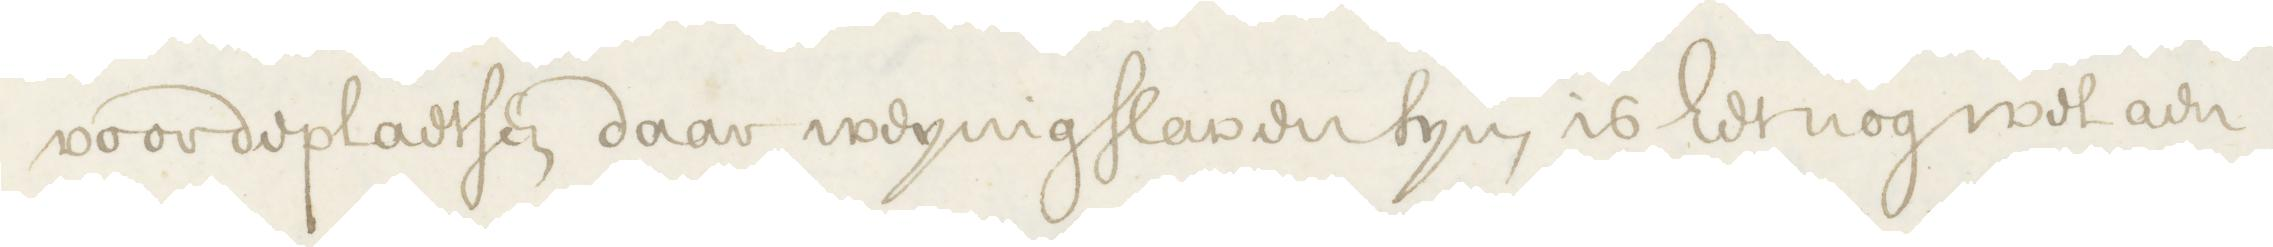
voor de plaetsen daar weynig slaven syn, is het nog wel aen
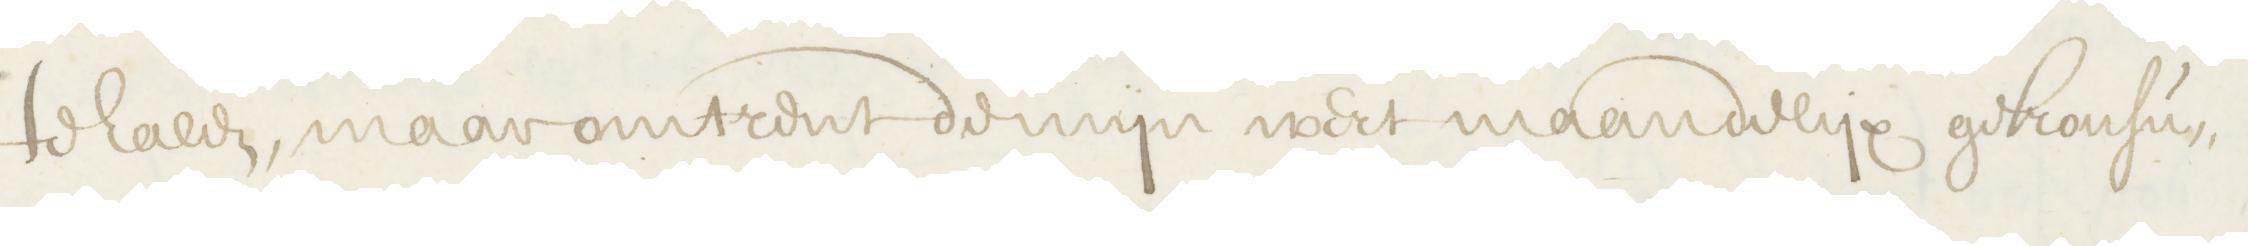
te halen, maar omtrent de mijn wert maandelijx gekonsu„
